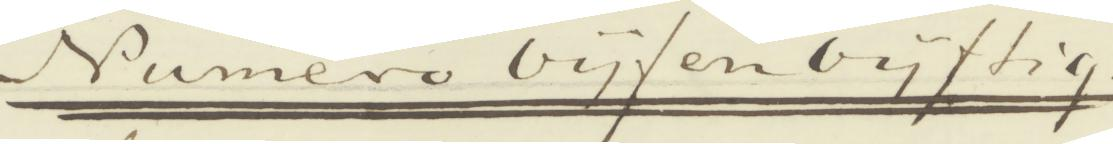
Numero vijf en vijftig
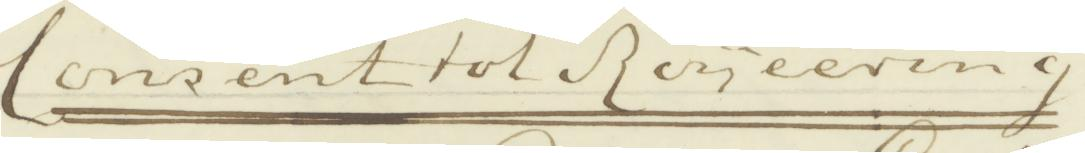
Consent tot Roijeering
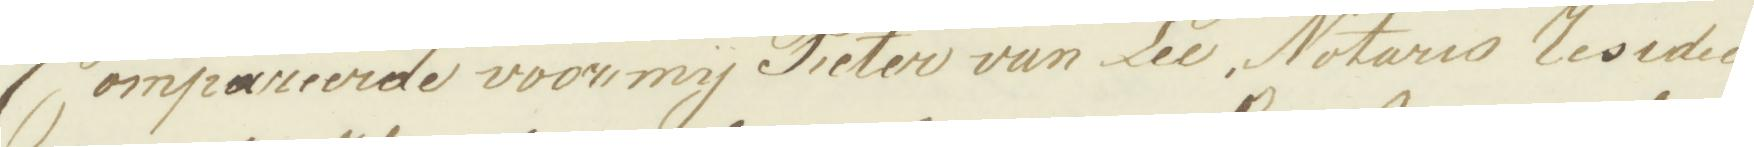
Compareerde voor mij Pieter van Lee, Notaris residee
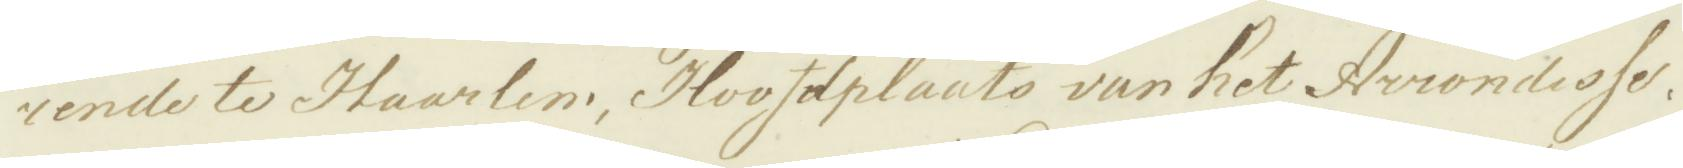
rende te Haarlem, Hoofdplaats van het Arrondisse.
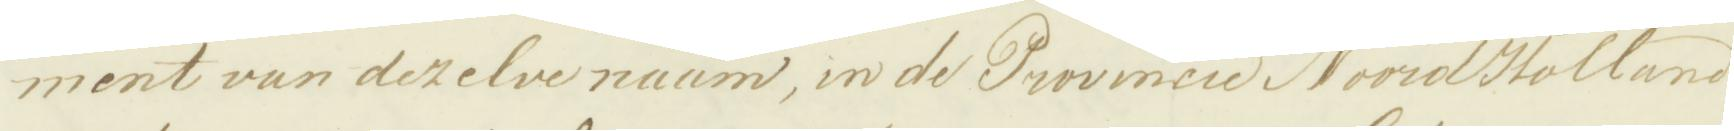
ment van dezelve naam, in de Provincie Noord Holland
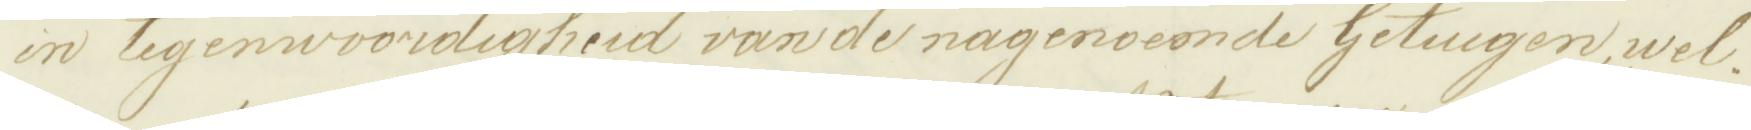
in tegenwoordigheid van de nagenoemde Getuigen, wel.
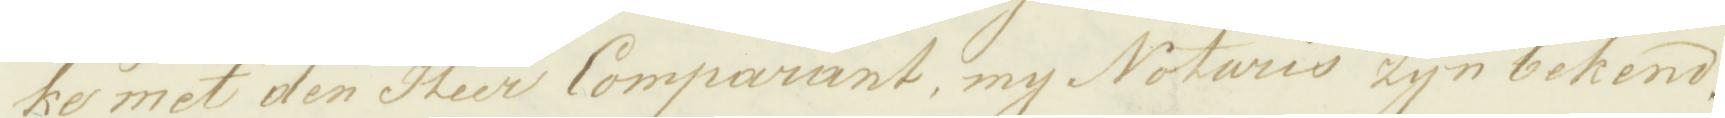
ke met den Heer Comparant, my Notaris zyn bekend.
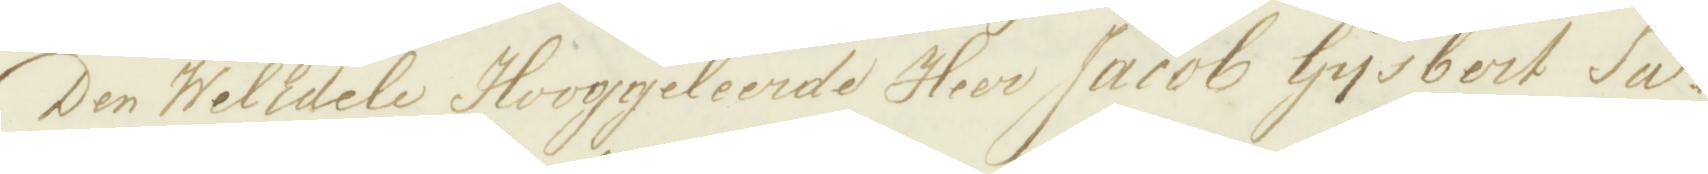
Den Wel Edele Hooggeleerde Heer Jacob Gysbert Sa„
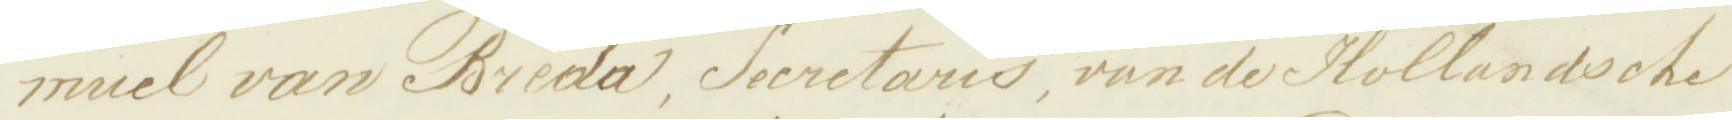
muel van Breda, Secretaris, van de Hollandsche
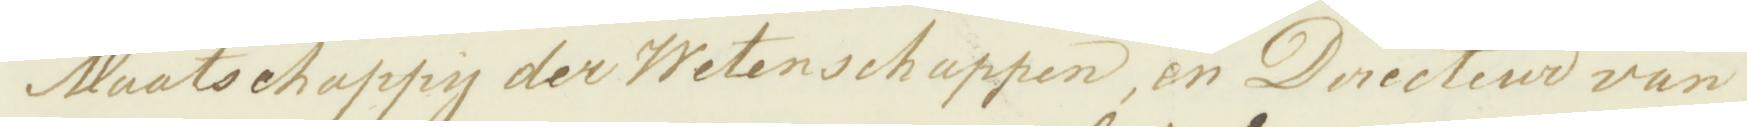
Maatschappij der Wetenschappen, en Directeur van
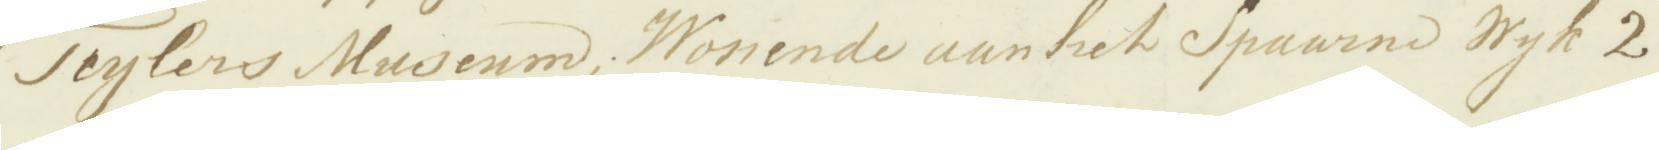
Teylers Museum, Wonende aan het Spaarne Wyk 2
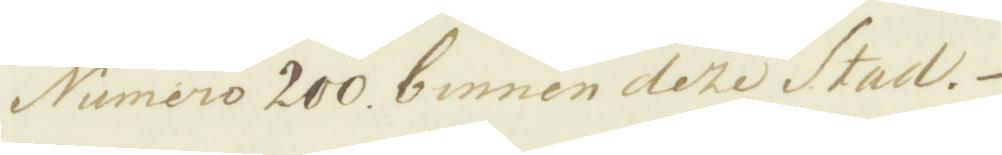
Numero 200. binnen deze Stad. –
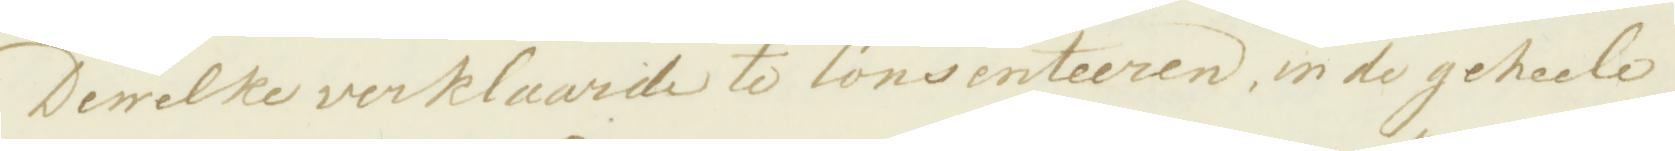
Dewelke verklaarde te Consenteeren, in de geheele
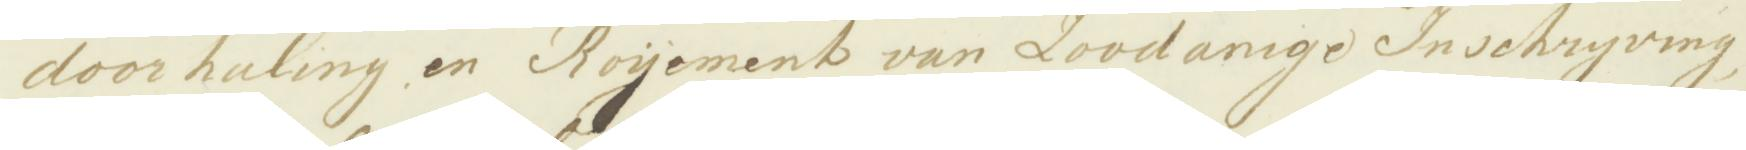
doorhaling, en Roijement van zoodanige Inschryving,
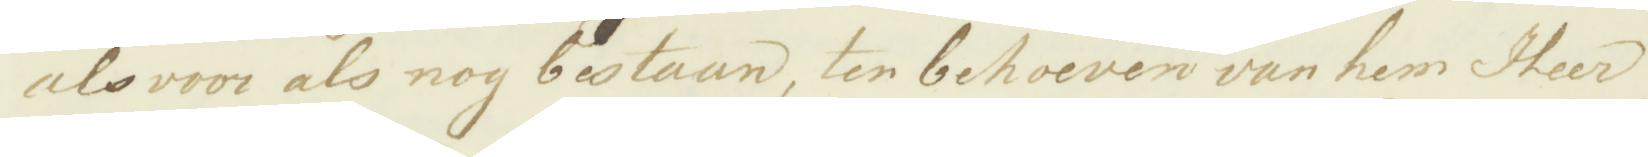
als voor als nog bestaan, ten behoeven van hem Heer
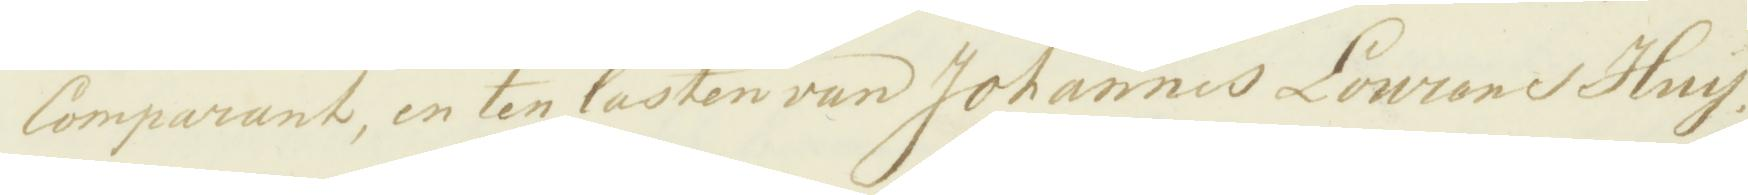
Comparant, en ten lasten van Johannes Lourens Huij
